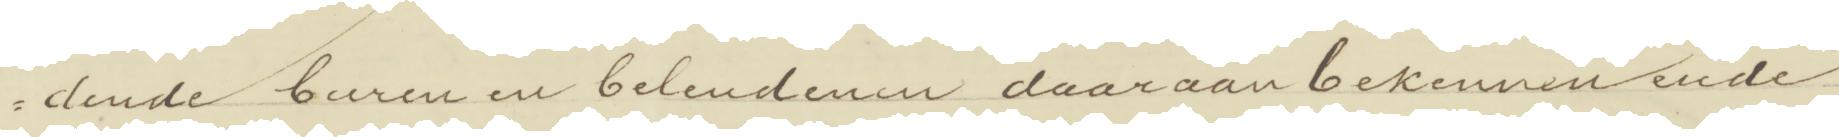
=dende buren en belendenen daar aan bekennen ende
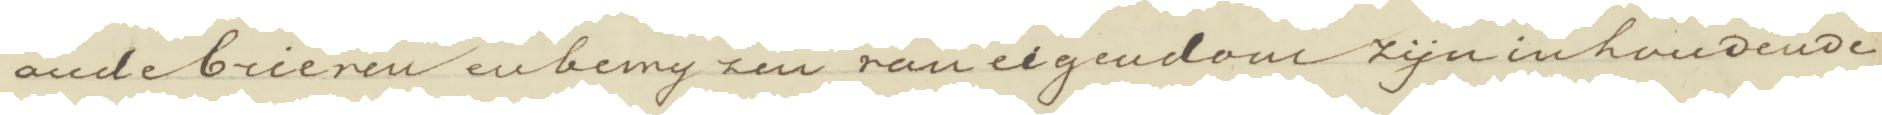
oude brieven en bewyzen van eigendom zijn inhoudende
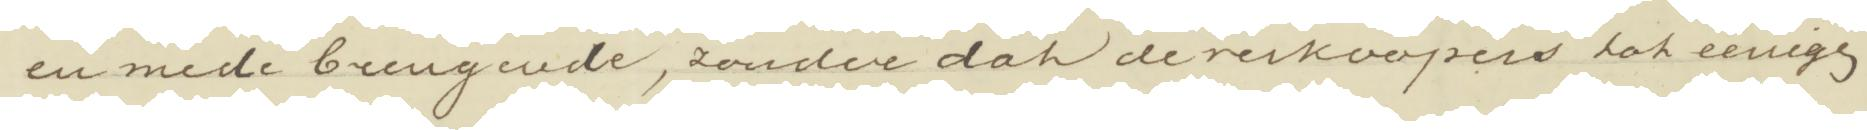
en mede brengende, zonder dat de verkoopers tot eenigen
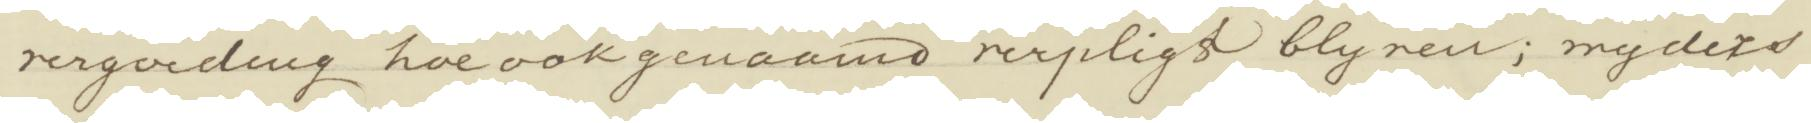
vergoeding hoe ook genaamd verpligt blyven; wyders
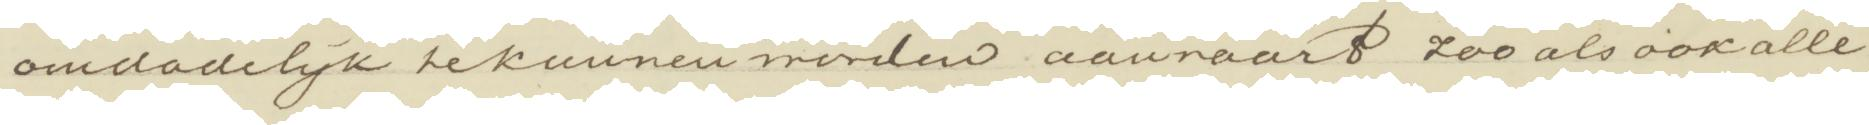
om dadelijk te kunnen worden aanvaart zoo als ook alle
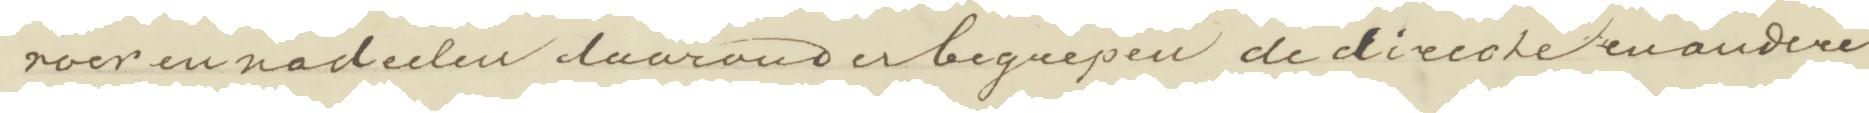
voor en nadeelen daaronder begrepen de directe en andere
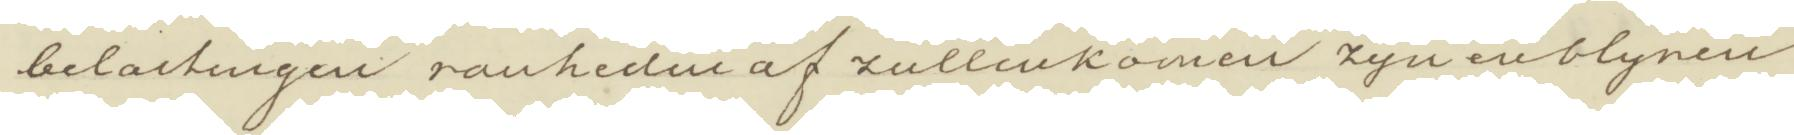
belastingen van heden af zullen komen zyn en blyven
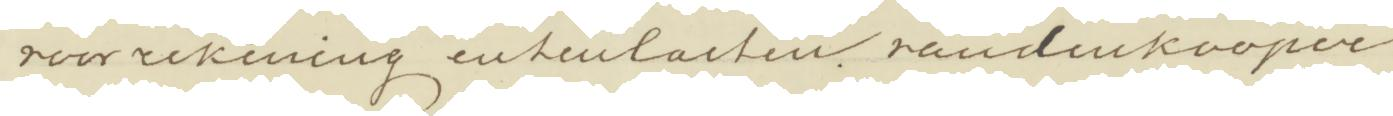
voor rekening en ten lasten vandenkooper
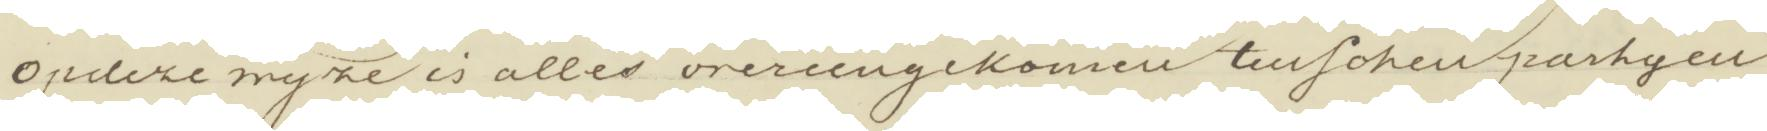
opdeze wyze is alles overeengekomen tusschen partyen
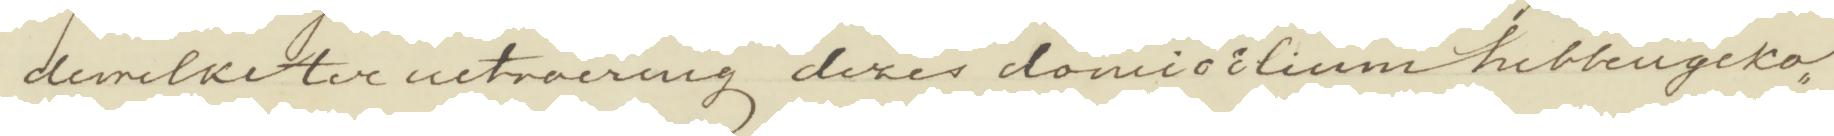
dewelke ter uitvoering dezes domicilium hebben geko„
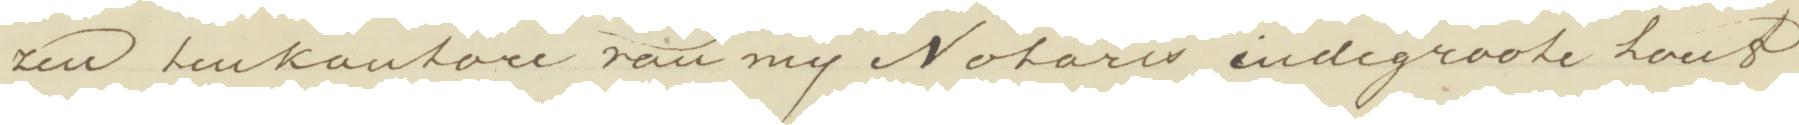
zen ten kantore van my Notaris in de groote hout
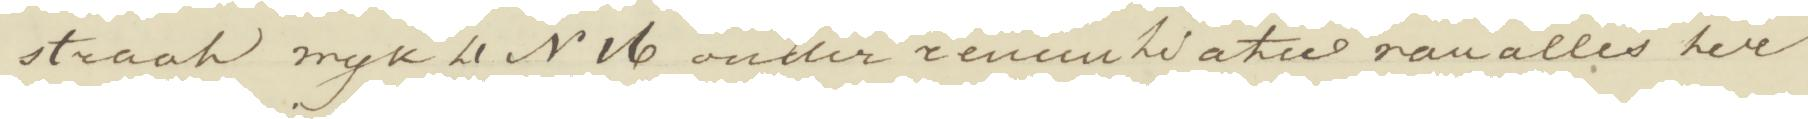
straat wyk 4 N 16 onder renuntiatie van alles ter
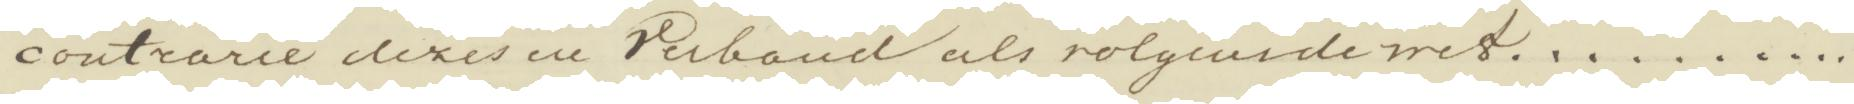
contrarie dezes en Verband als volgens de wet. . . . . . . . . .
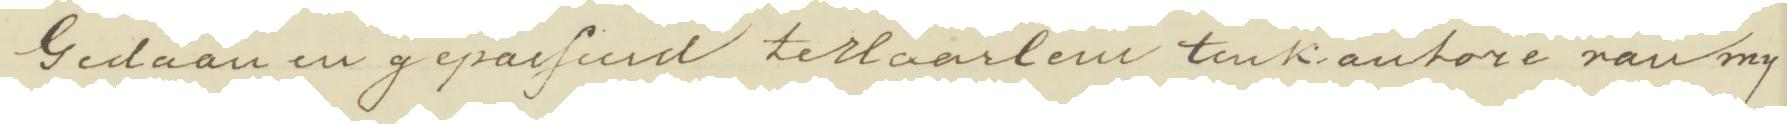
Gedaan en gepasseerd te Haarlem ten kantore van my
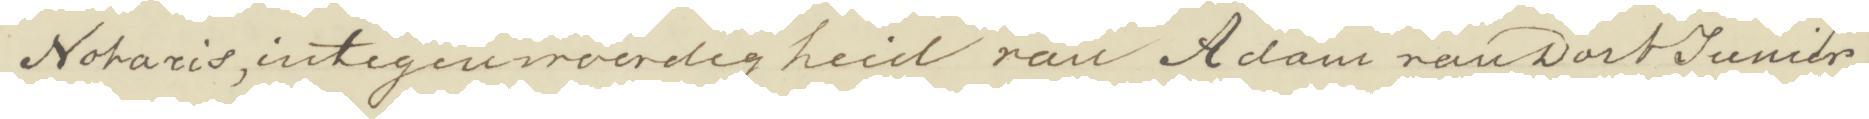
Notaris, integenwoordigheid van Adam van Dort Iunior
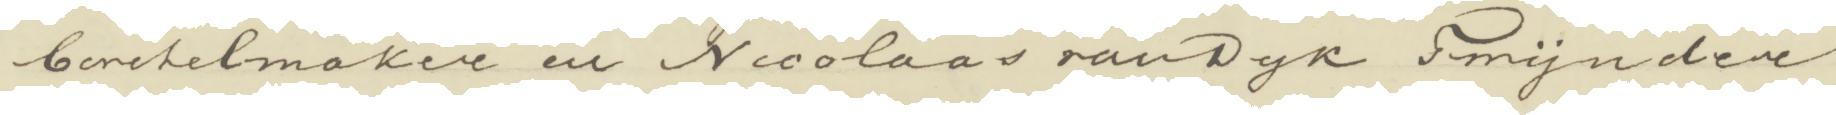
borstelmaker en Nicolaas van Dyk Twijnder
